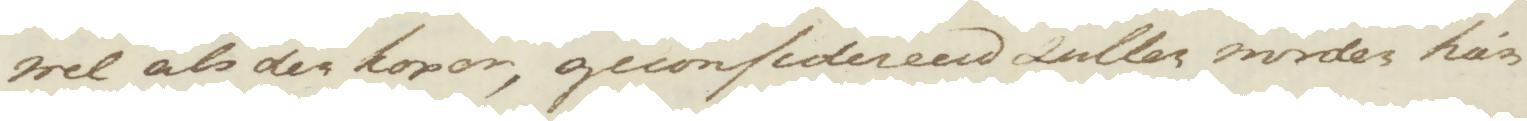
wel als den koper, geconsidereerd zullen worden hun
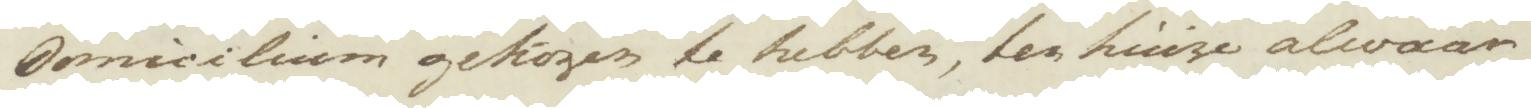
domicilium gekozen te hebben, ten huize alwaar
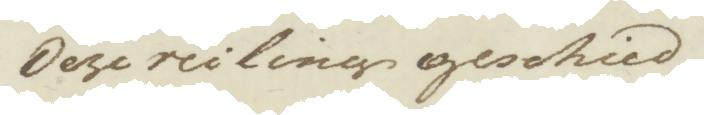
deze veiling geschied.
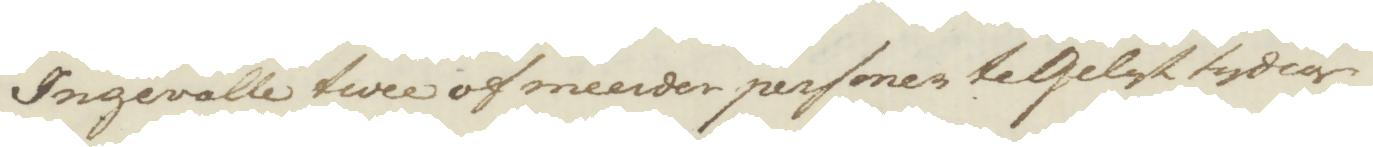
Ingevalle twee of meerder personen te Gelyktydig
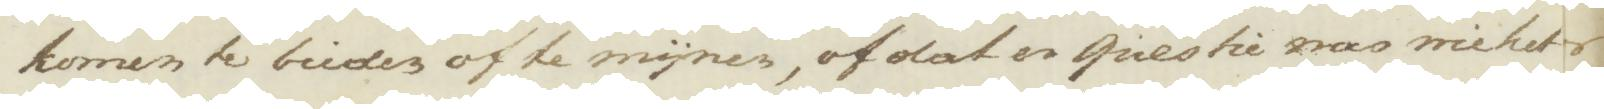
komen te bieden of te mijnen, of dat er questie was wie het
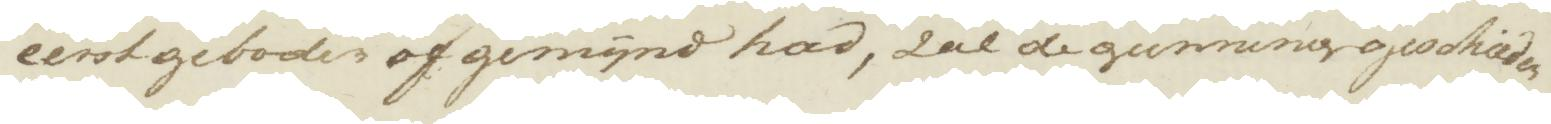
eerstgeboden of gemijnd had, zal de gunninig geschieden
